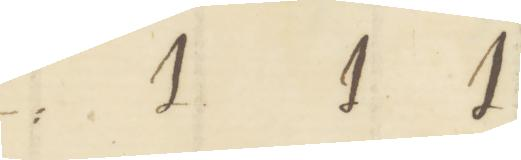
1 1 1
